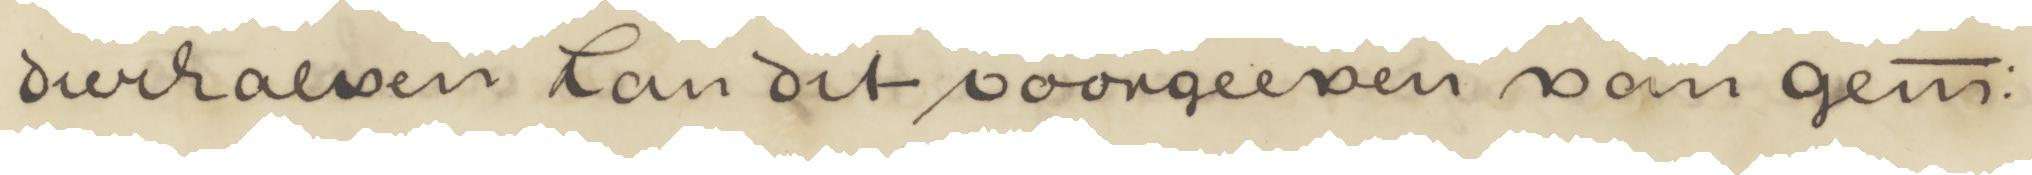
dierhalven kan dit voorgeeven van gem:
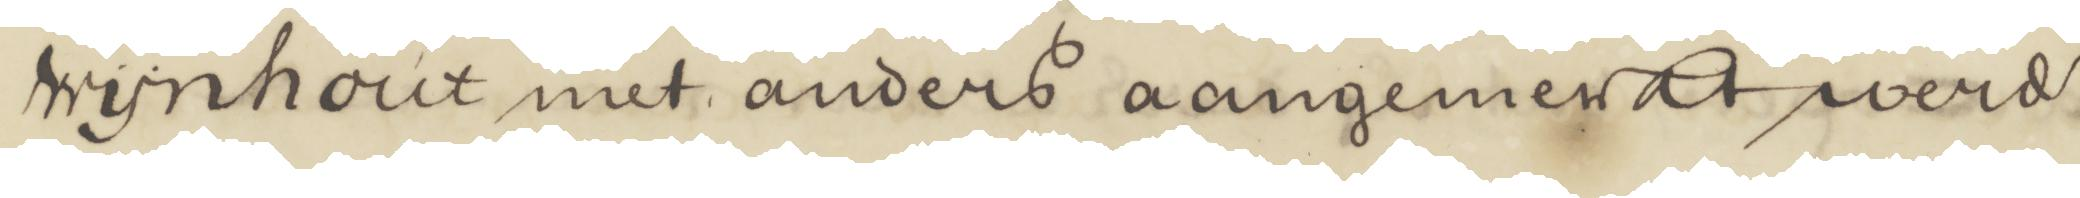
wijnhout niet anders aangemerkt werde
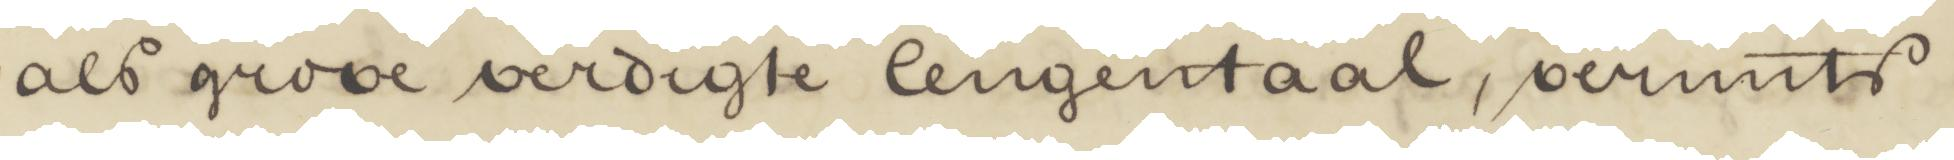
als grove verdigte leugentaal, vermits
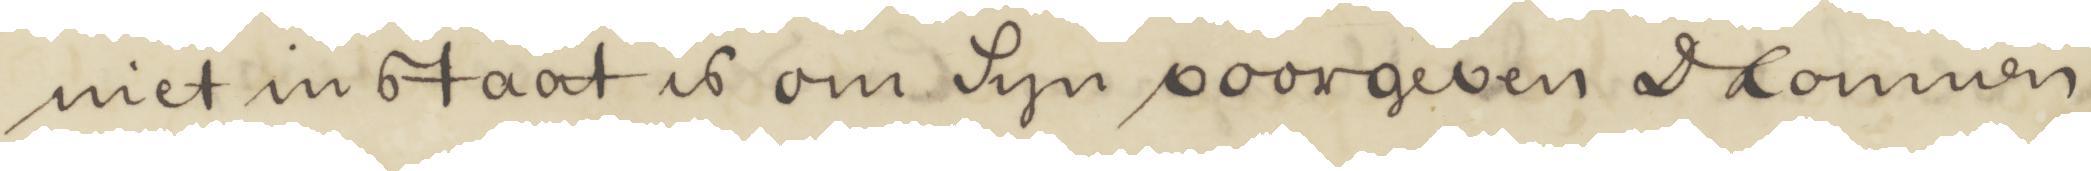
niet in staat is om syn voorgeven te konnen
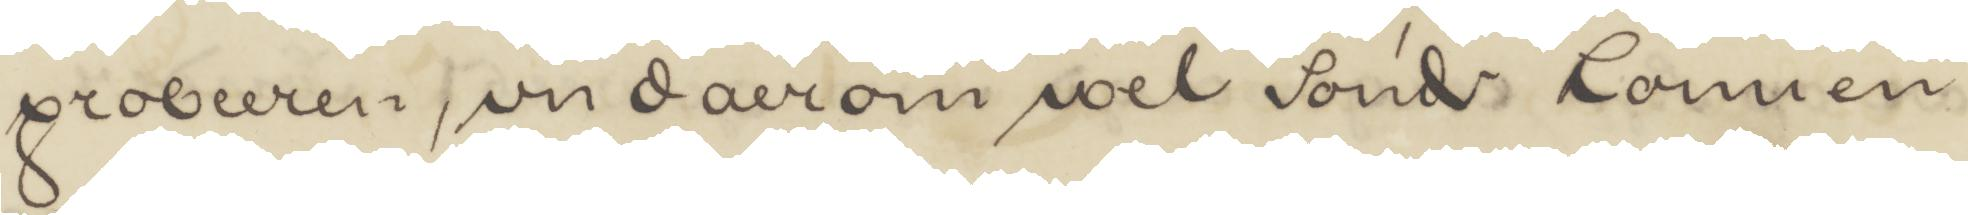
probeeren, en daerom wel soude konnen
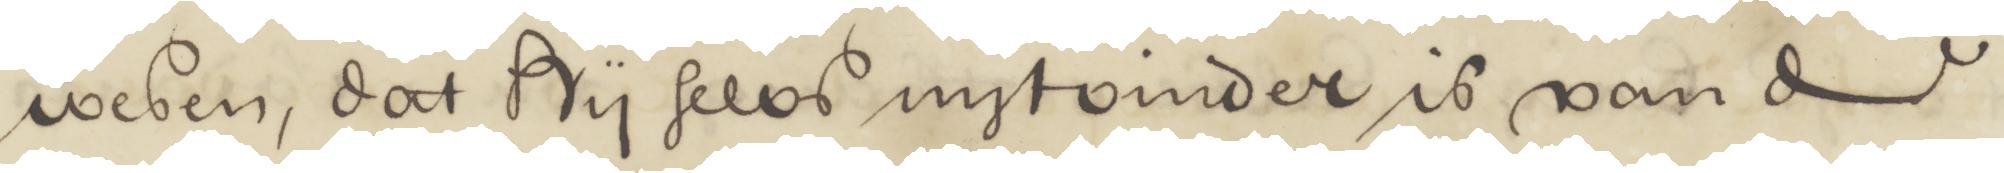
wesen, dat hij selvs uytvinder is van de
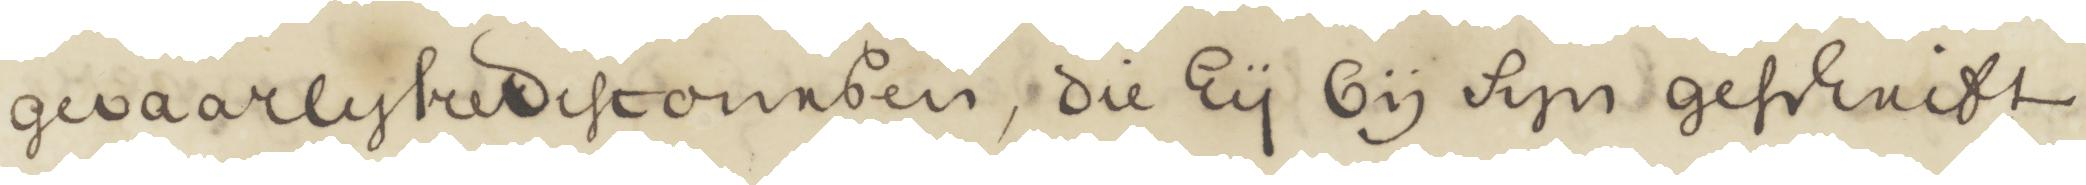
gevaarlyke discoursen, die hij bij syn geschrift
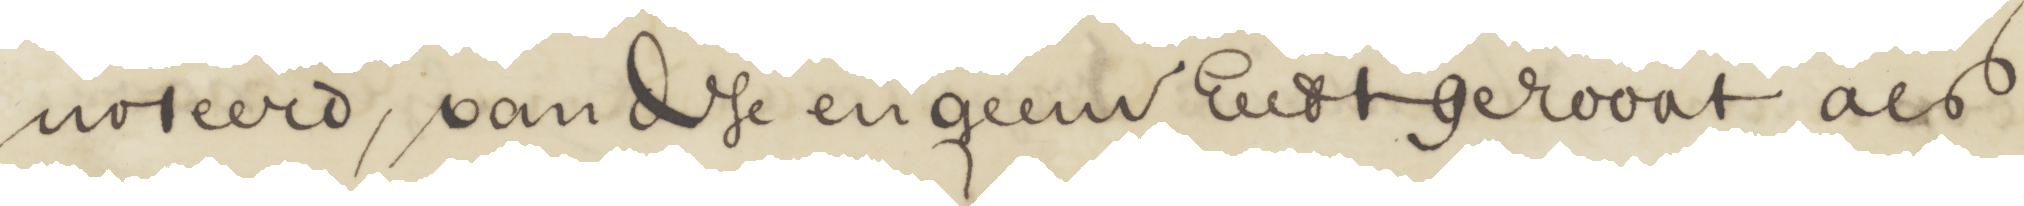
noteerd, van dese en geene heeft gehoort als
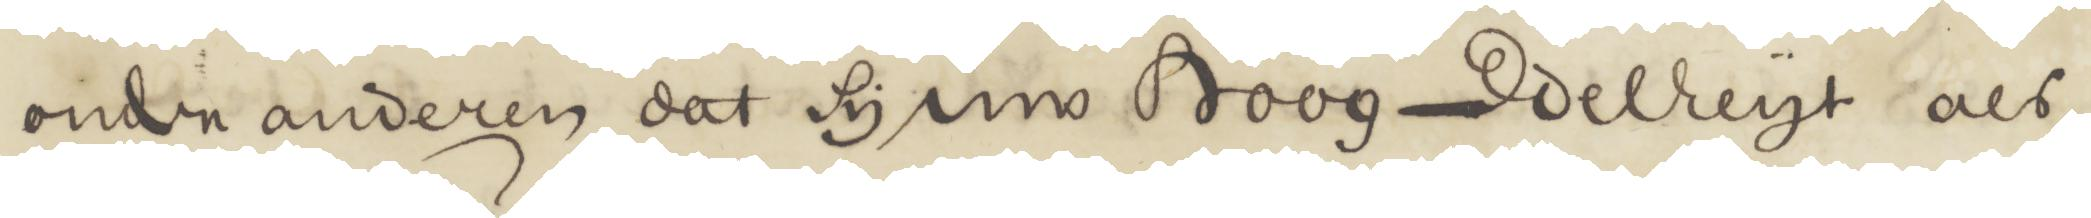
onder anderen dat sij uw Hoog Edelheijt als
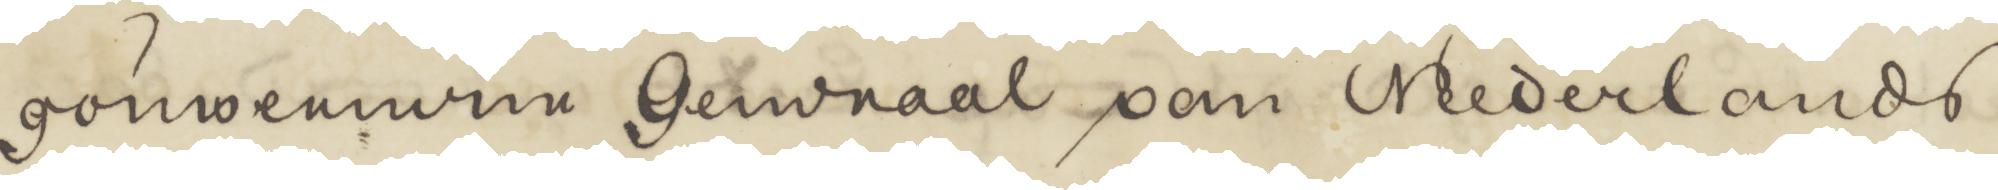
gouverneur Generaal van Nederlands
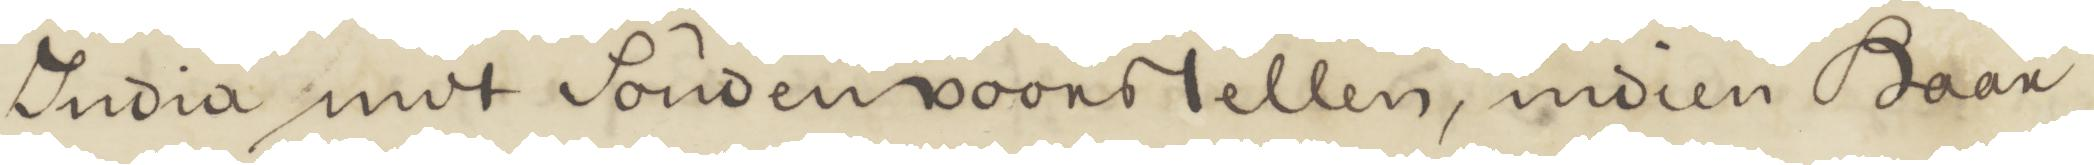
India niet souden voorstellen, indien Haar
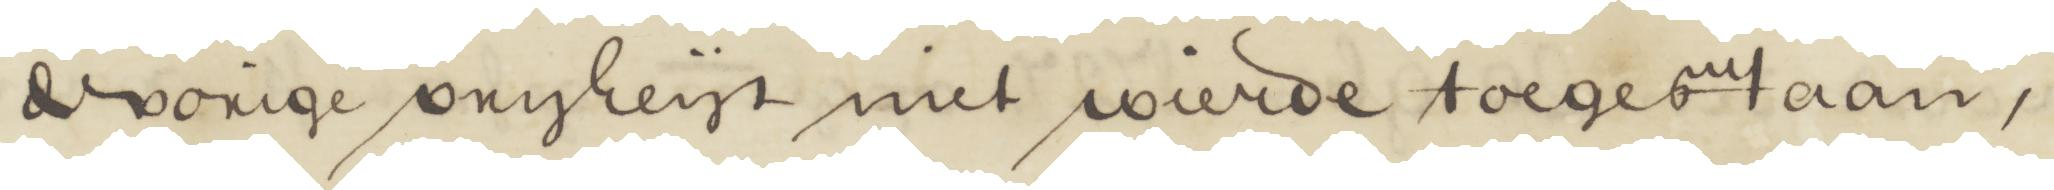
de vorige vryheijt niet wierde toegestaan,
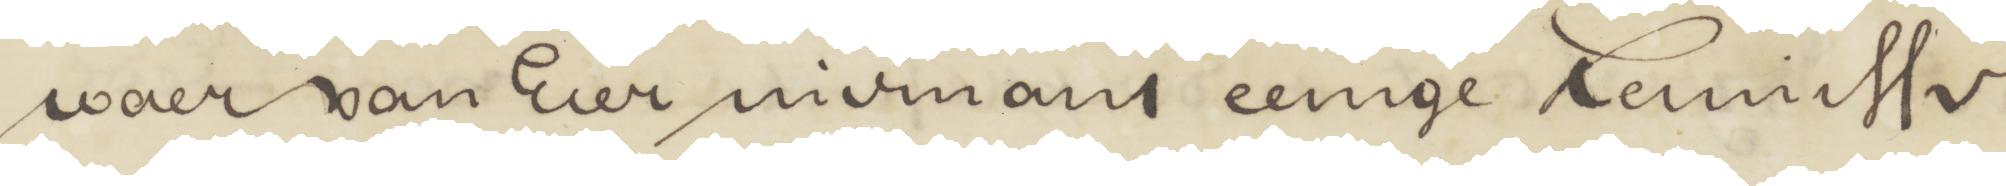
waer van hier niemant eenige kennisse
